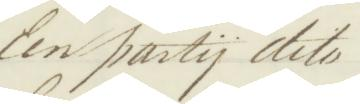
Een partij dito
